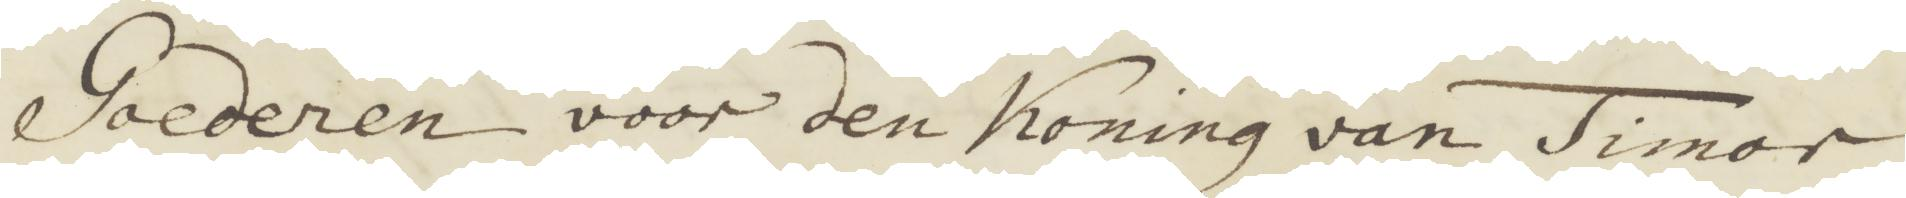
Goederen voor den Koning van Timor
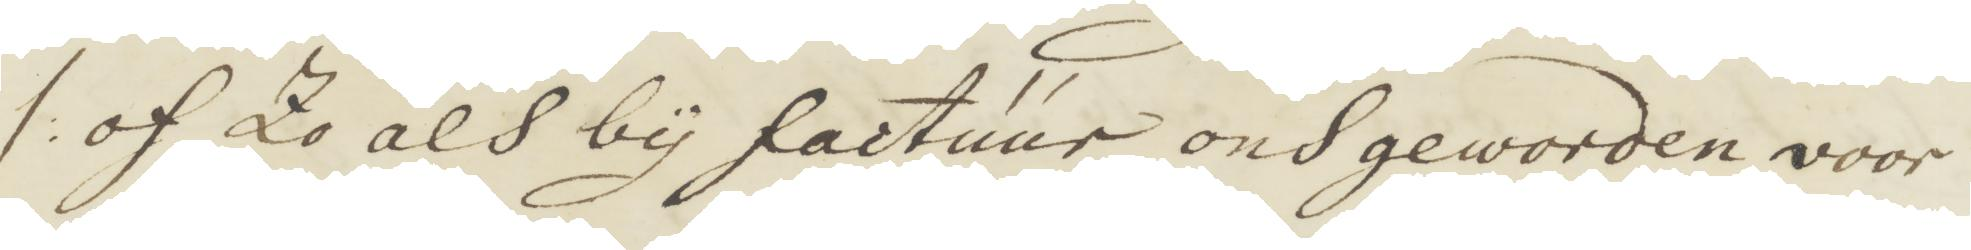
/: of zo als bij factuur ons geworden voor
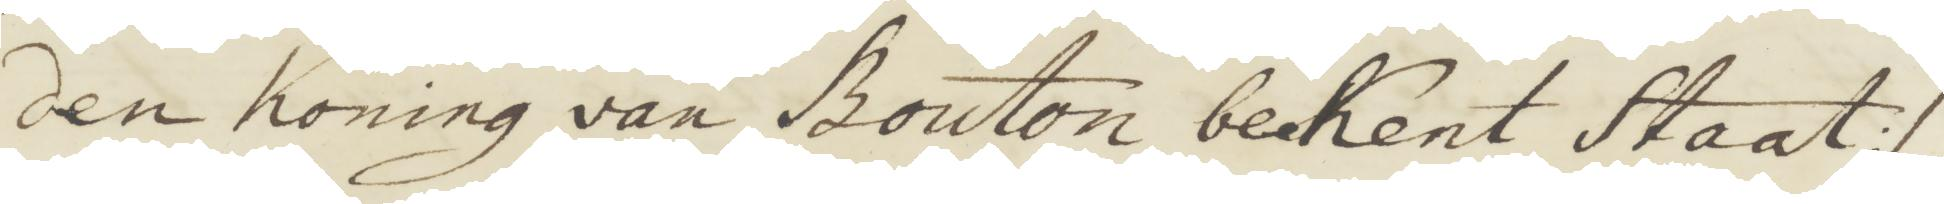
den Koning van Bouton bekent staat:/
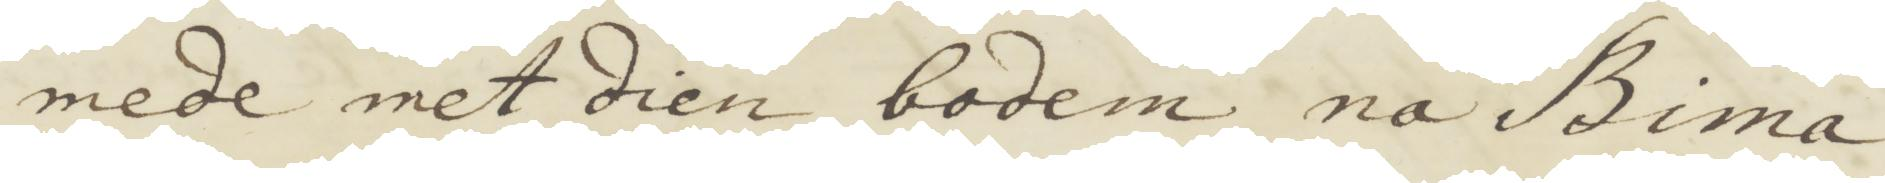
mede met dien bodem na Bima
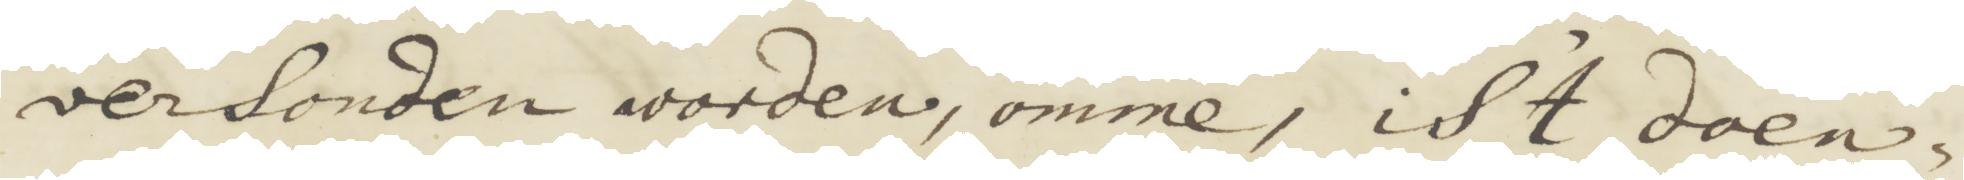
versonden worden, omme, is ’t doen,
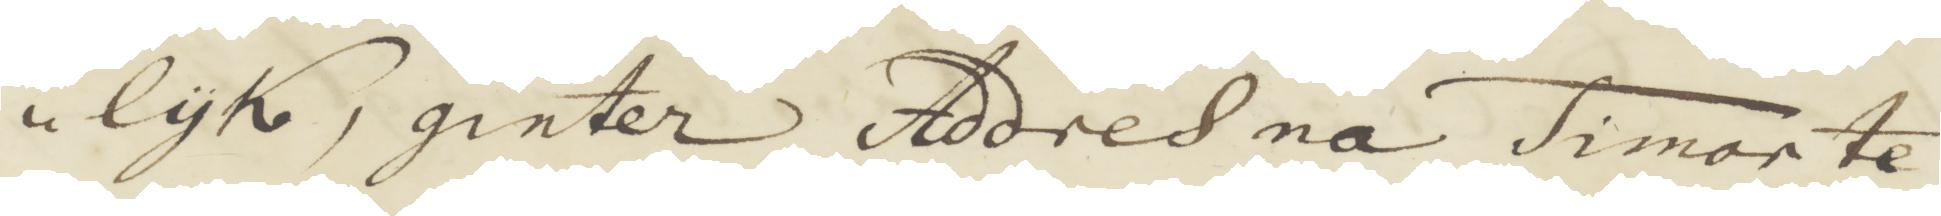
„lijk, ginter Addres na Timor te
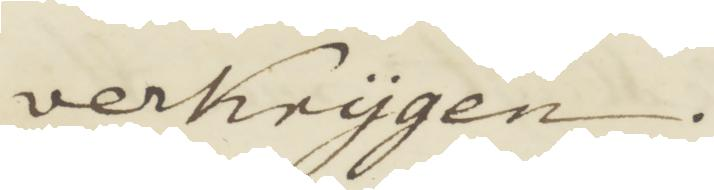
verkrijgen.
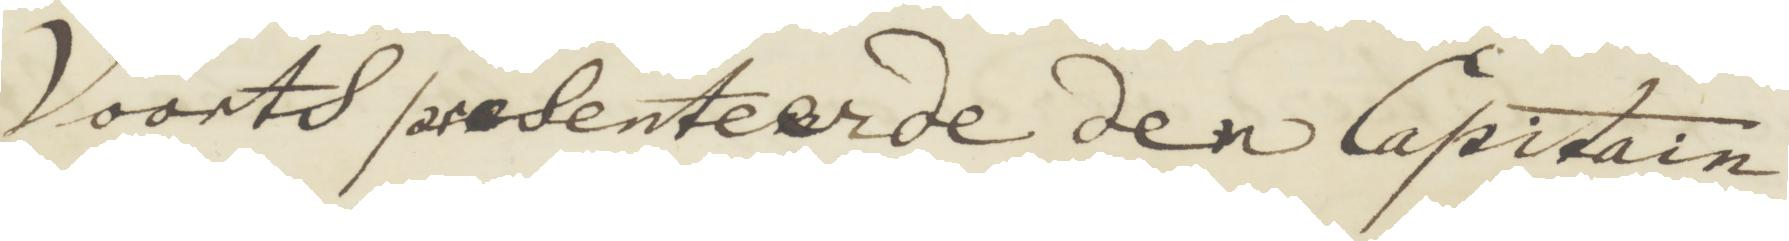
Voorts presenteerde den Capitain
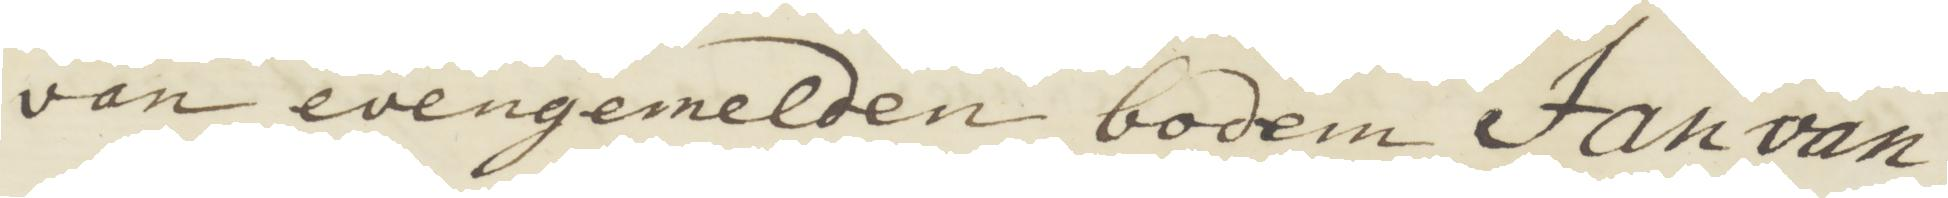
van evengemelden bodem Ian van
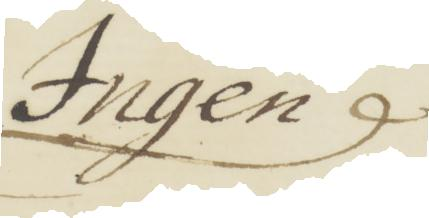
Ingen
